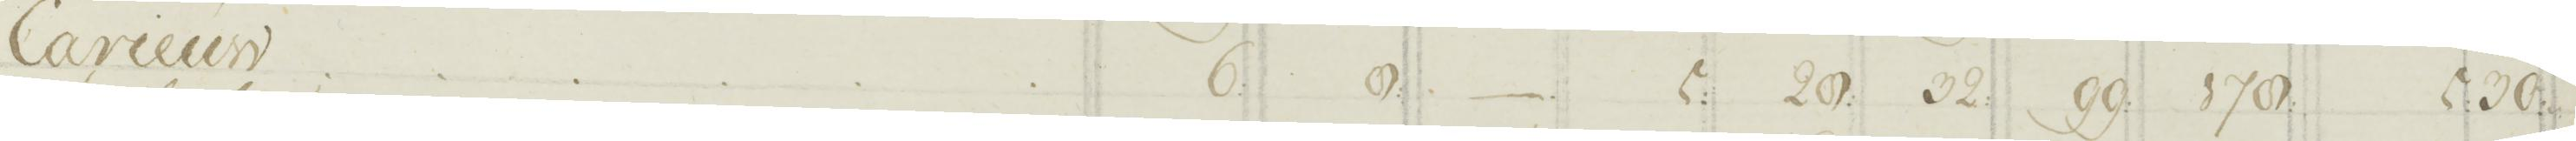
Carieuw - - - - - - 6: 8: —. 5: 28: 32: 99: 178: 5: 30:.
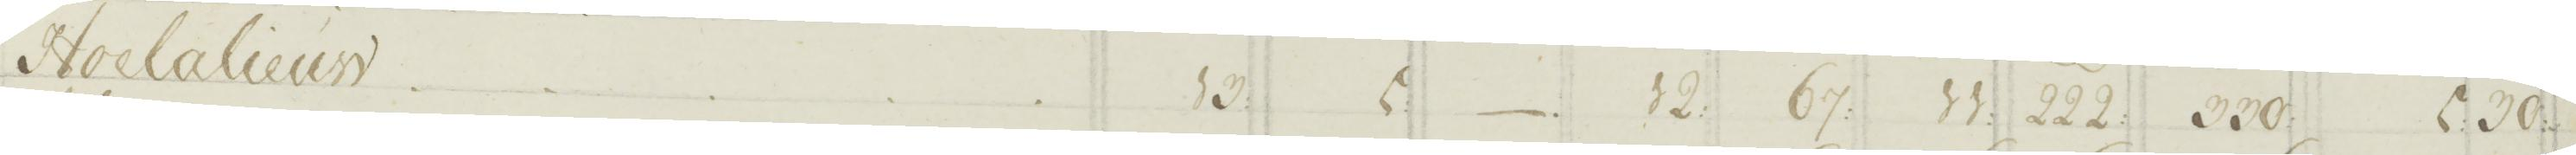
Hoelalieuw - - - - - 13: 5: —. 12: 67: 11: 222: 330: 5: 30:.
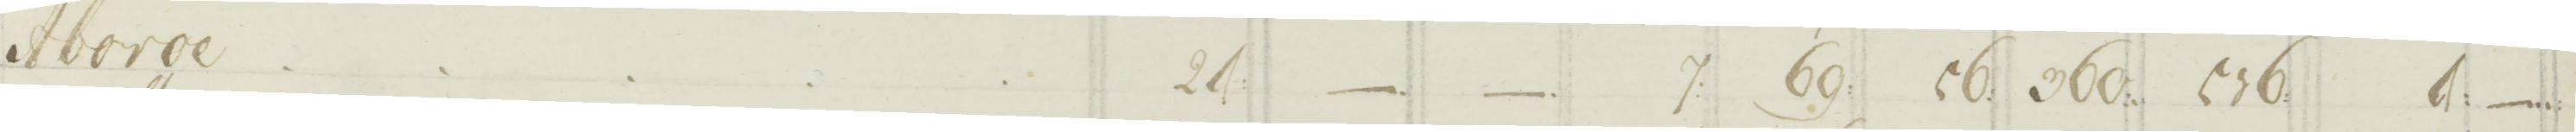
Aboroe - - - - - 24: —. —. 7: 69: 56: 360: 516: 4: —..
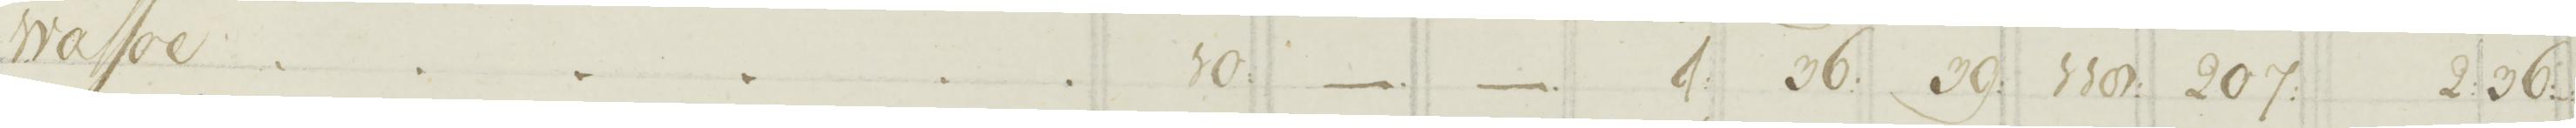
Wassoe - - - - - - 10: —. —. 4: 36: 39: 118: 207: 2: 36:.
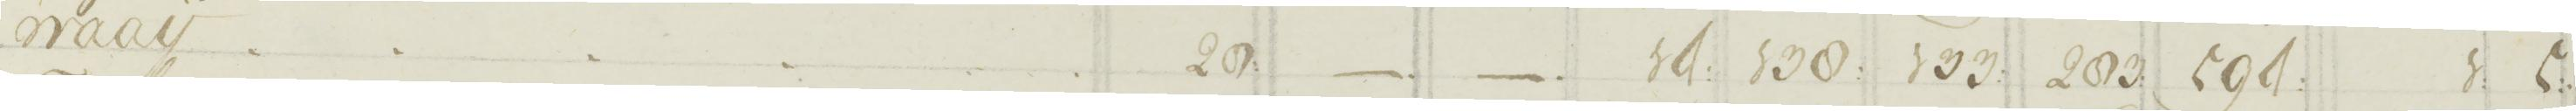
waaij - - - - - - 28: —. —. 14: 138: 133: 283: 594: 1: 5:
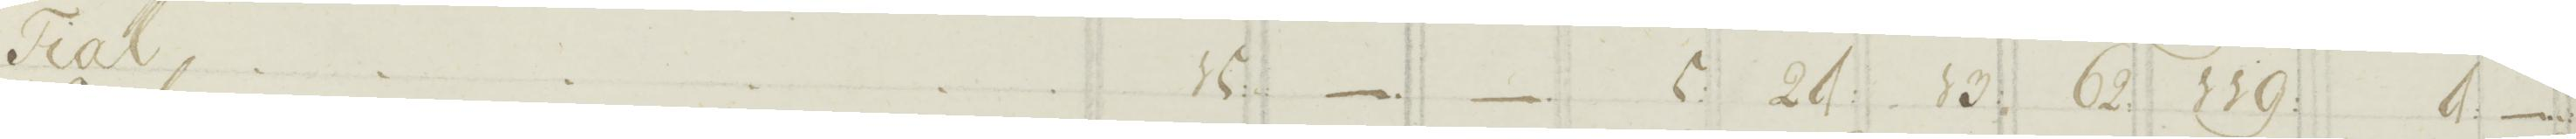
Tial - - - - - - 15: —. — 5: 24: 13: 62: 119: 4: —..
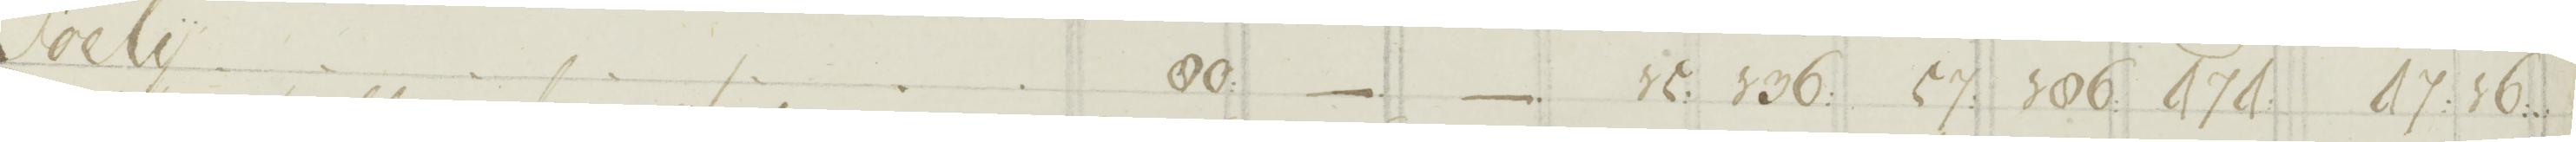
Foelij - - - - - - 80: —. —. 15: 136: 57: 186: 474: 47: 16:.
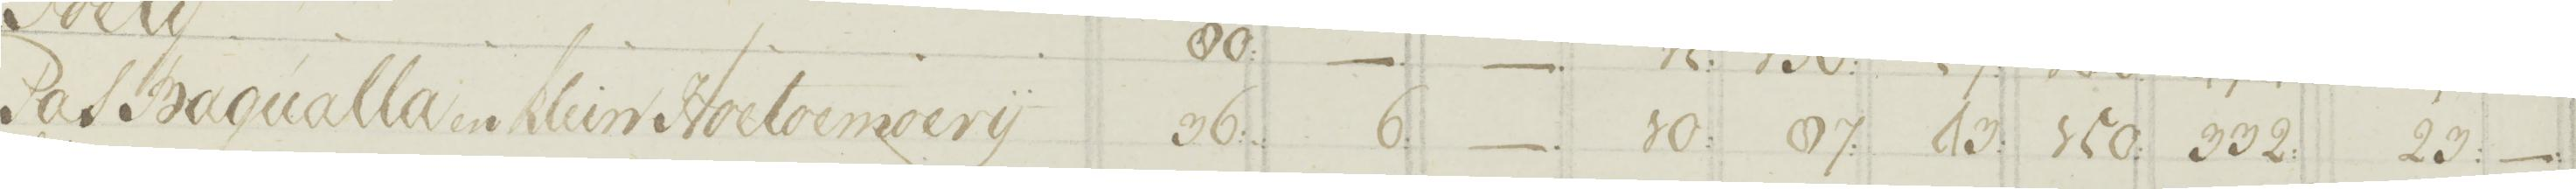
Pas Baqualla in klein Hoetoemoerij 36: 6: —. 10: 87: 43: 150: 332: 23: —:
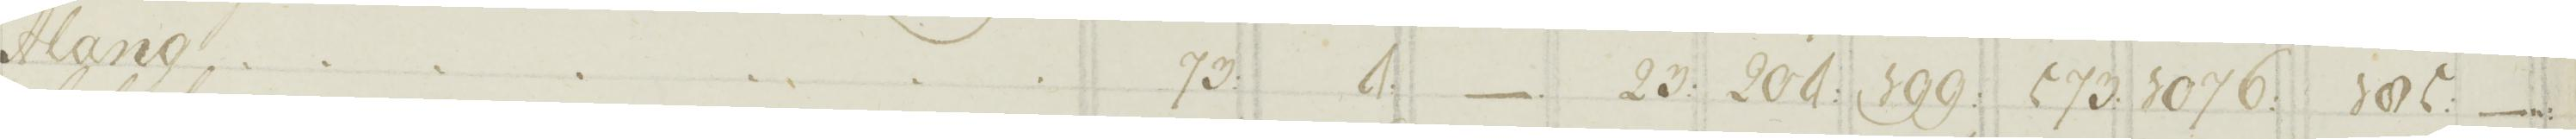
Alang - - - - - - - 73: 4: —. 23: 204: 199: 573: 1076: 185: —..:
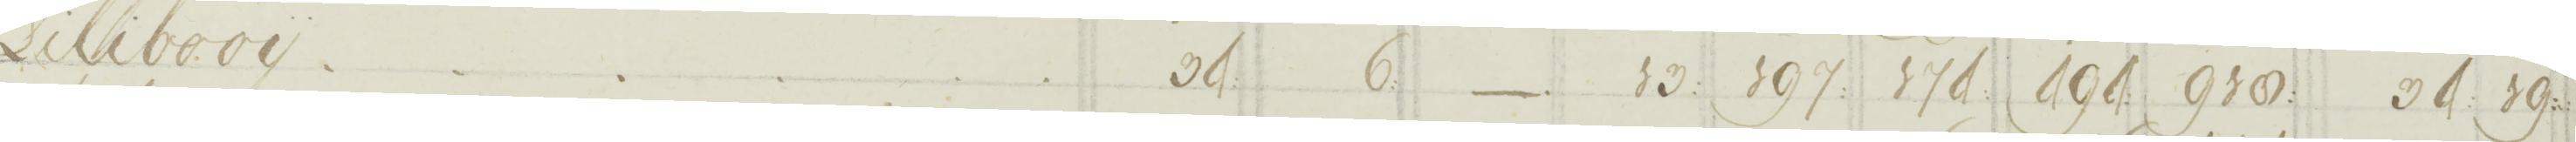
Lilibooij - - - - - - 34: 6: —. 13: 197: 174: 494: 918: 34: 19:.:
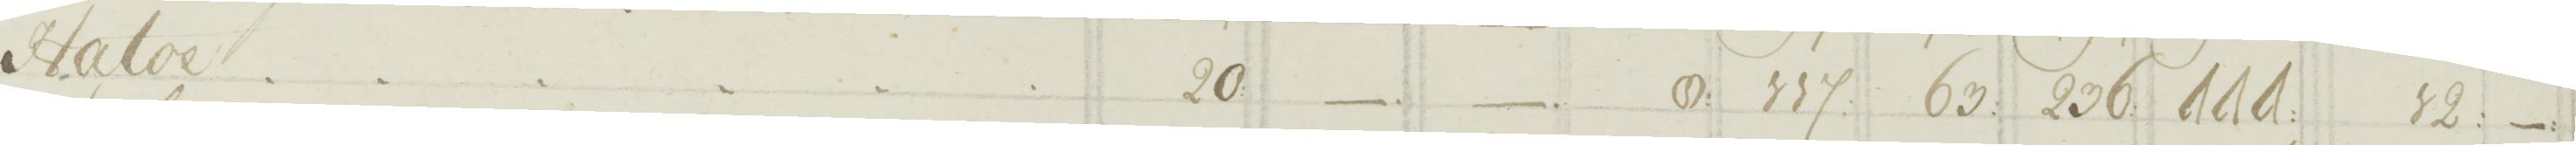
Hatoe - - - - - - 20: —. —. 8: 117: 63: 236: 444: 12: —
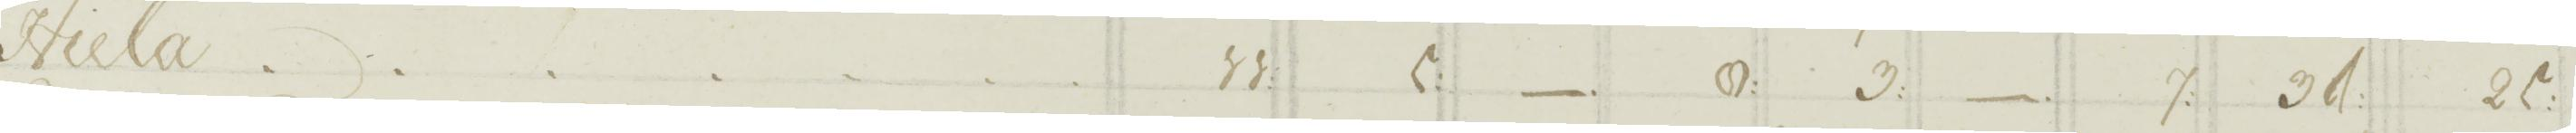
Hiela - - - - - - - 11: 5: —. 8: 3: —. 7: 34: 25:
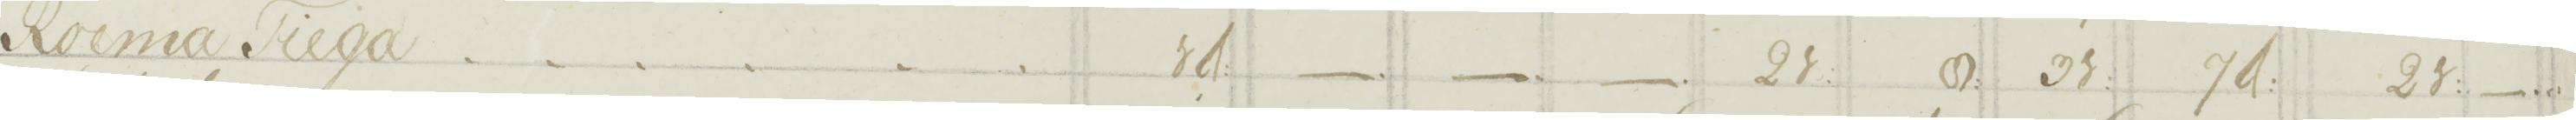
Roema Tiega - - - - - - 14: —. —. —. 21: 8: 31: 74: 21: —...
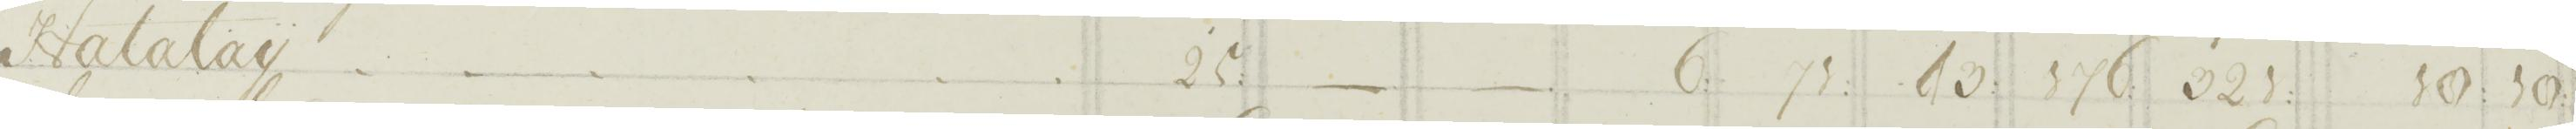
Hatalaij - - - - - - 25: —. —. 6: 71: 43: 176: 321: 18: 38:
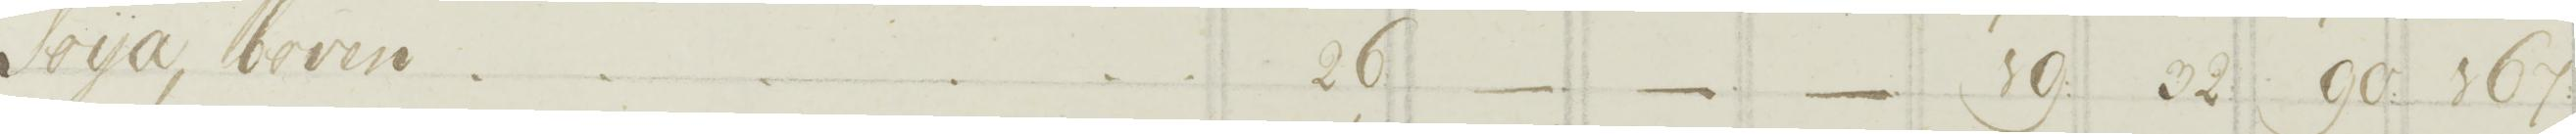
Soija boven - - - - - - 26: —. —. —. 19: 32: 90: 167:
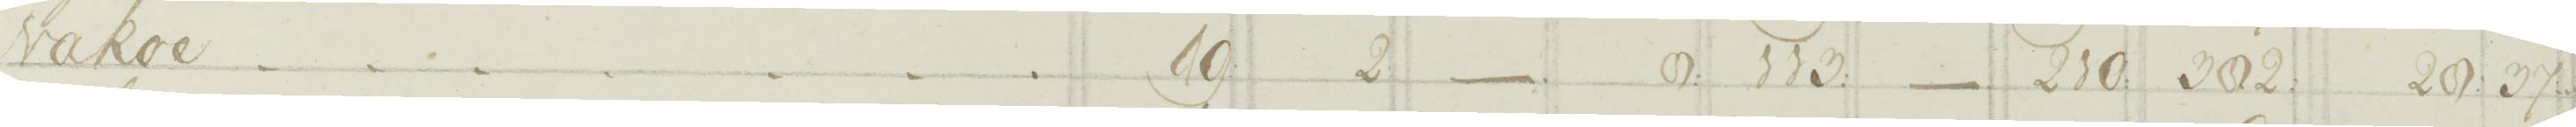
Nakoe - - - - - - - 49: 2: —. 8: 113: —. 210: 382: 28: 37:.
